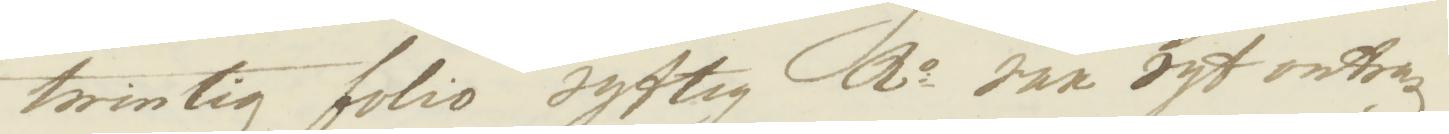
twintig folio vyftig R:o van vyf ontvan
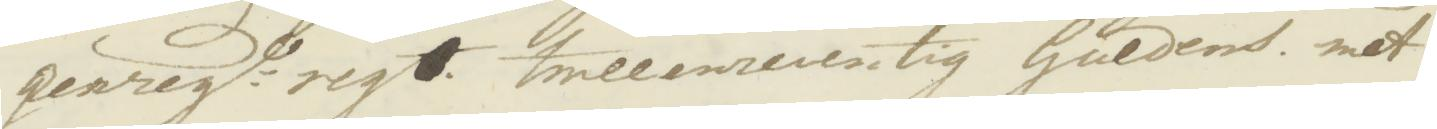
gen reg=l regt. tweeenzeventig Guldens. met
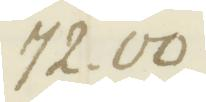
72.00
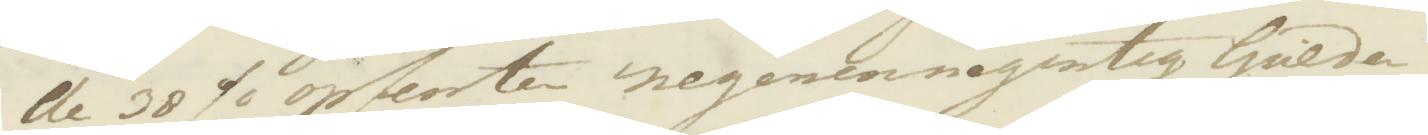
de 38 % opCenten negenennegentig Gulden
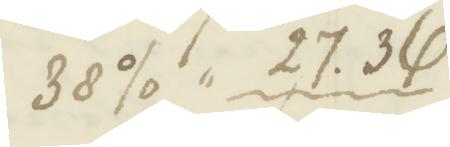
38% „ 27.36
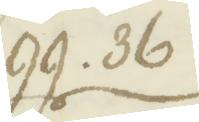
99.36
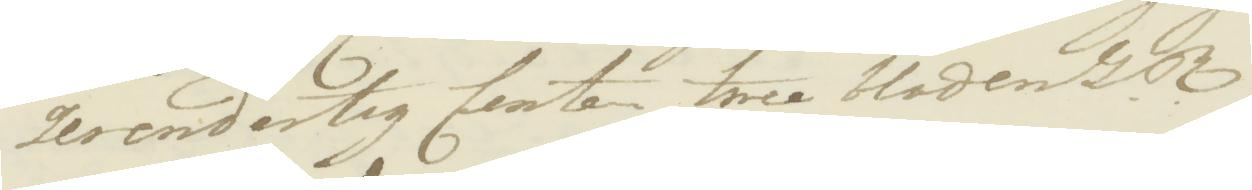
zevendertig Centen twee bladen Z.R.
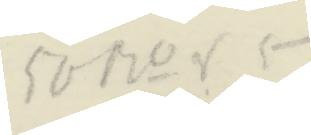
50 R_o v5
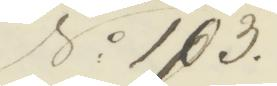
N:o 103.
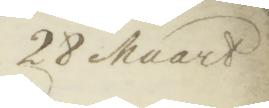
28 Maart
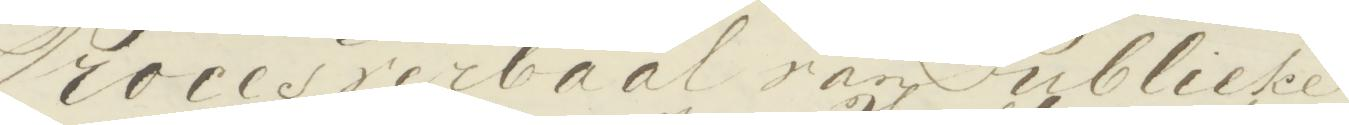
Proces verbaal van Publieke
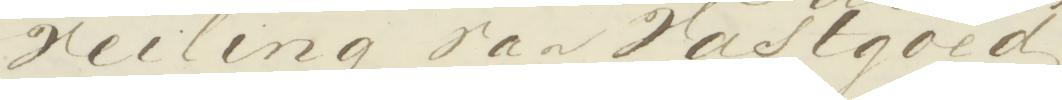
Veiling van Vastgoed
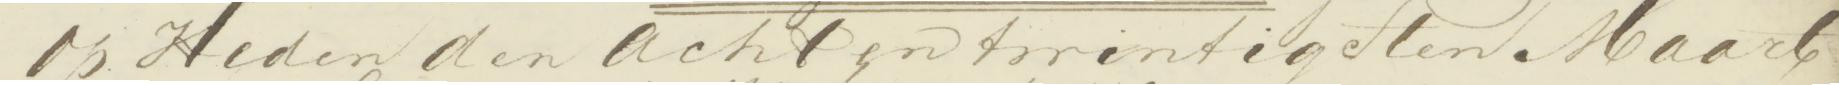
op Heden den acht en twintigsten Maart
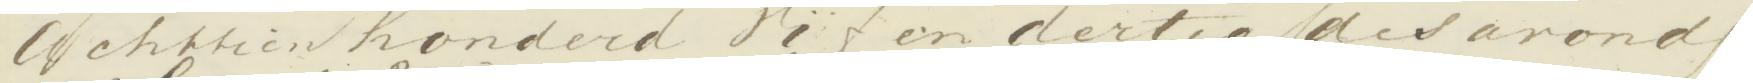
achttien honderd vijf en dertig des avonds
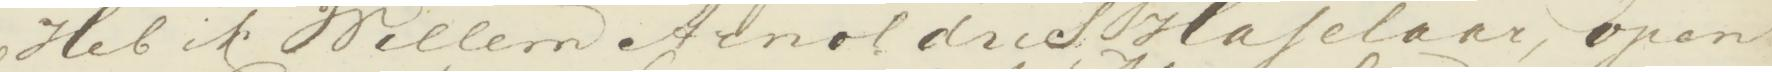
„Heb ik Willem Arnoldus Haselaar, open
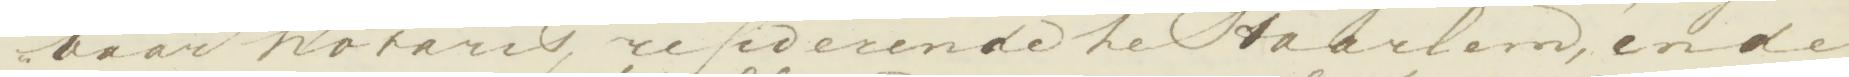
„baar notaris, residerende te Haarlem, in de
